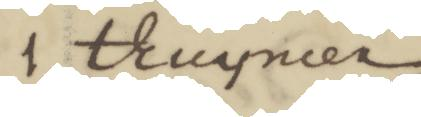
1 thuynier
